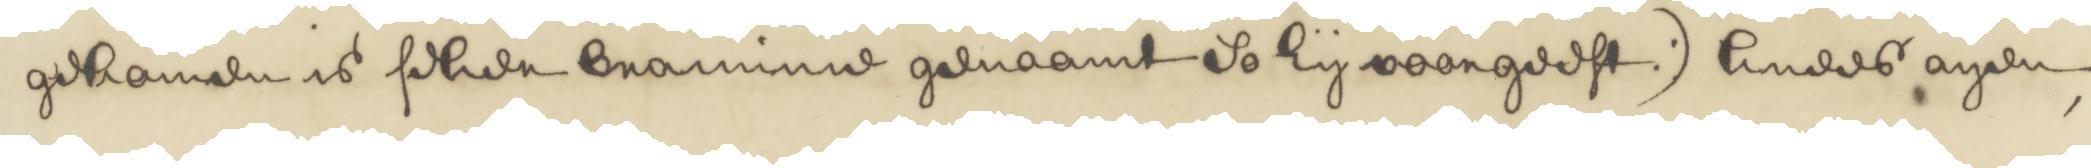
gekomen is seker braminie genaamt so hij voorgeeft:) knees aijen,
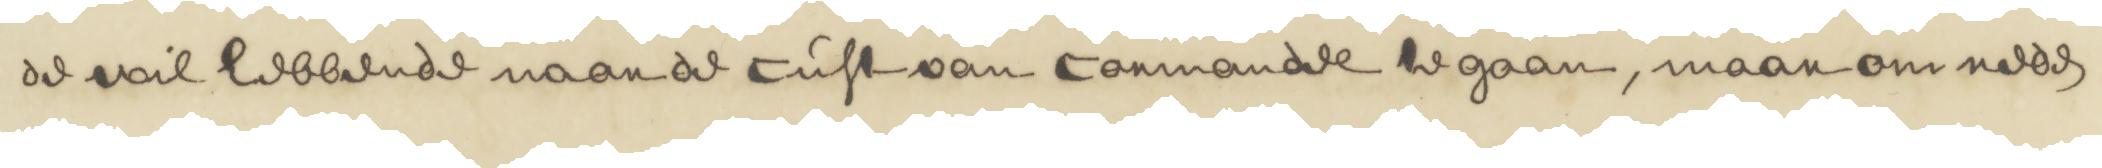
de wil hebbende naar de cust van cormandel te gaan, maar om reden
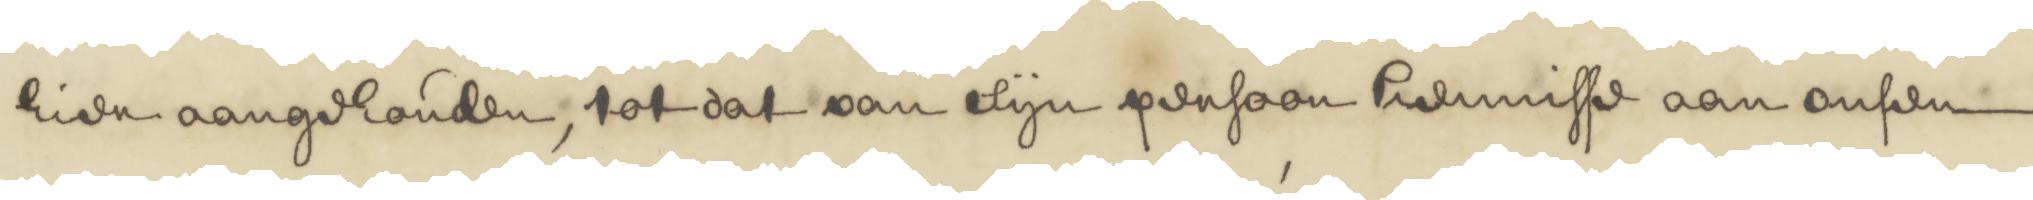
hier aangehouden, tot dat van sijn persoon kennisse aan onsen
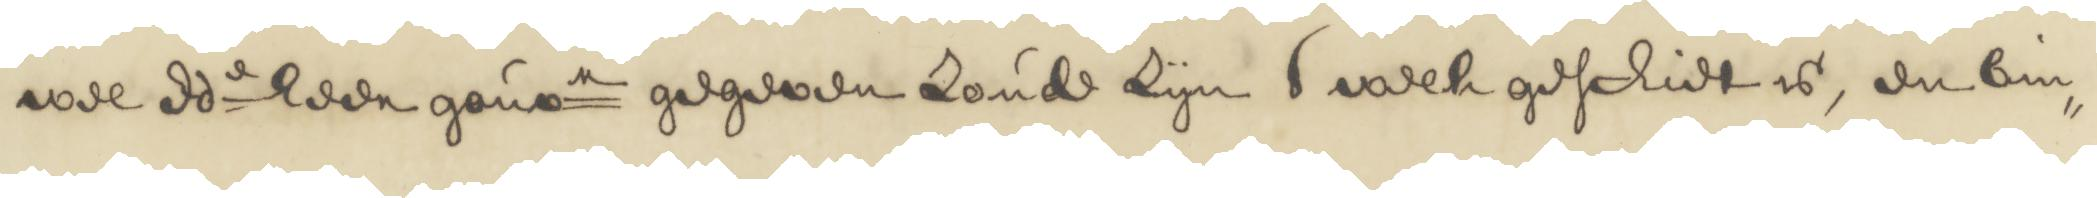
wel Ed=e heer gouv=r gegeven zoude zijn 't welk geschiet is, en bin„
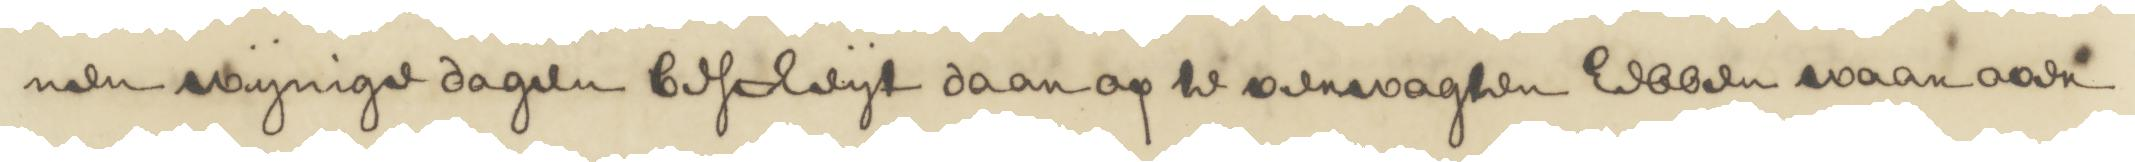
nen wijnige dagen bescheijt daar op te verwagten hebben waar over
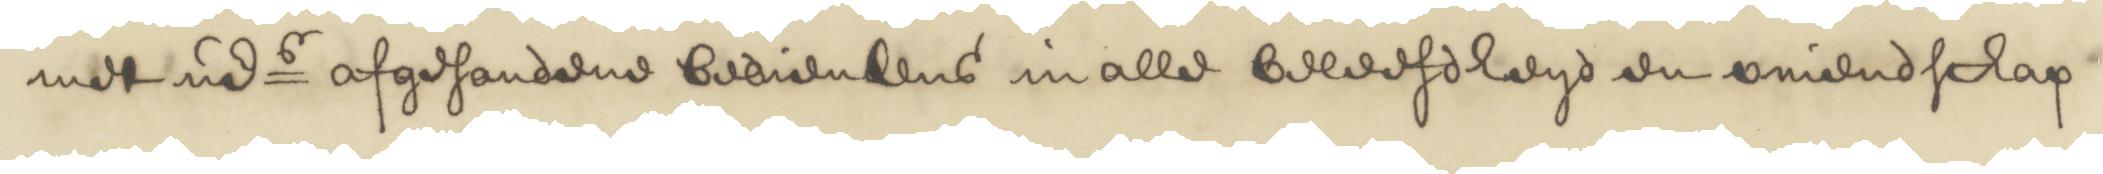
met uE=s afgesondene bediendens in alle beleefdheijd en vriendschap
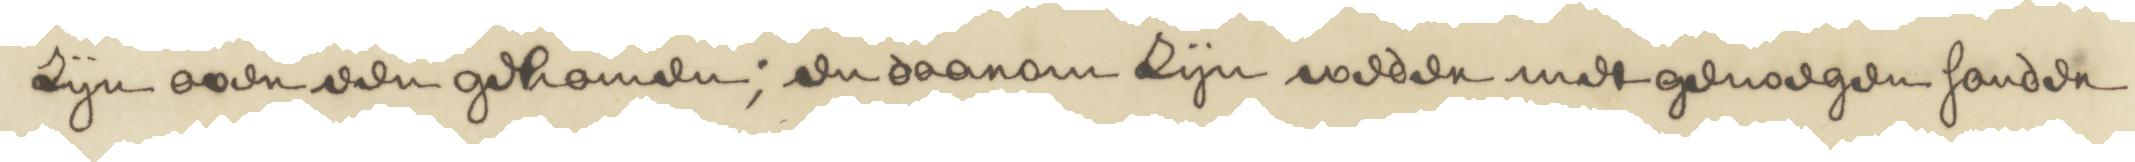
zijn over een gekomen; en daarom zijn weder met genoegen sonder
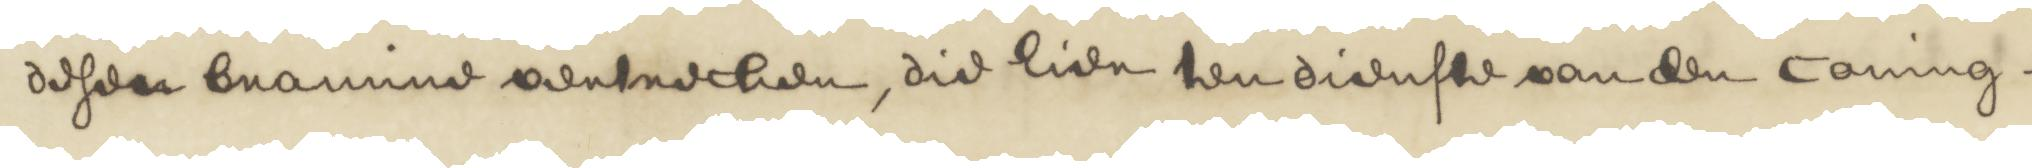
desen bramine vertrecken, die hier ten dienste van den coning
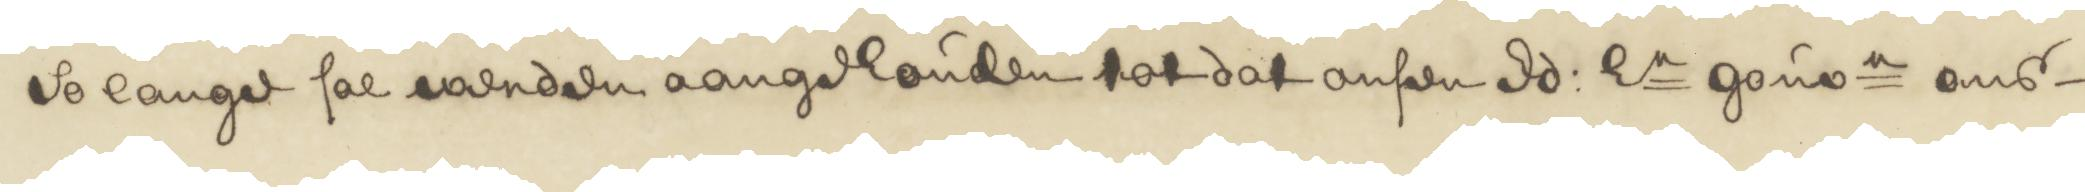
so lange sal werden aangehouden tot dat onsen Ed: h=r gouv=r ons
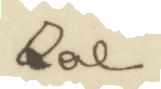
zal
